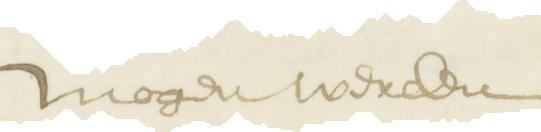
mogen werden
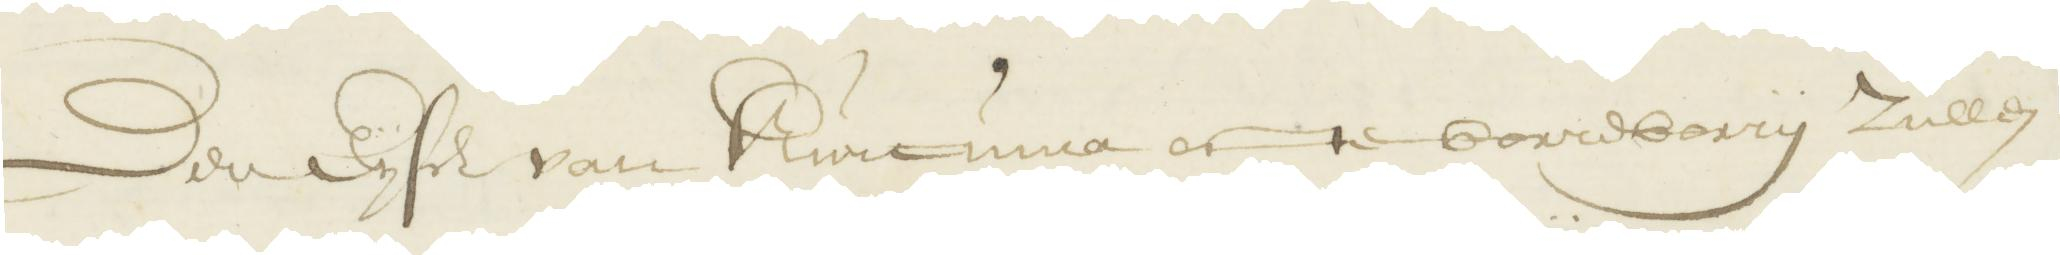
Den Eijsch van kurcuma ofte borreborrij zullen
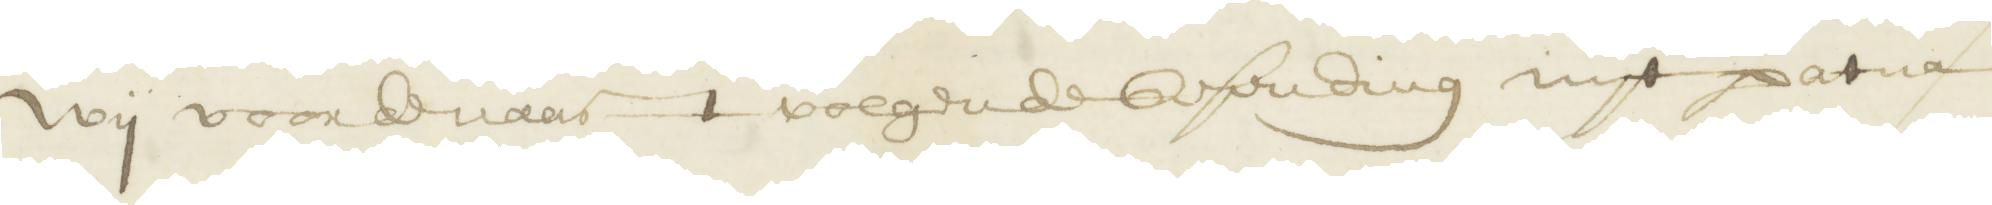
wij voor de naast volgende besending uijt patna
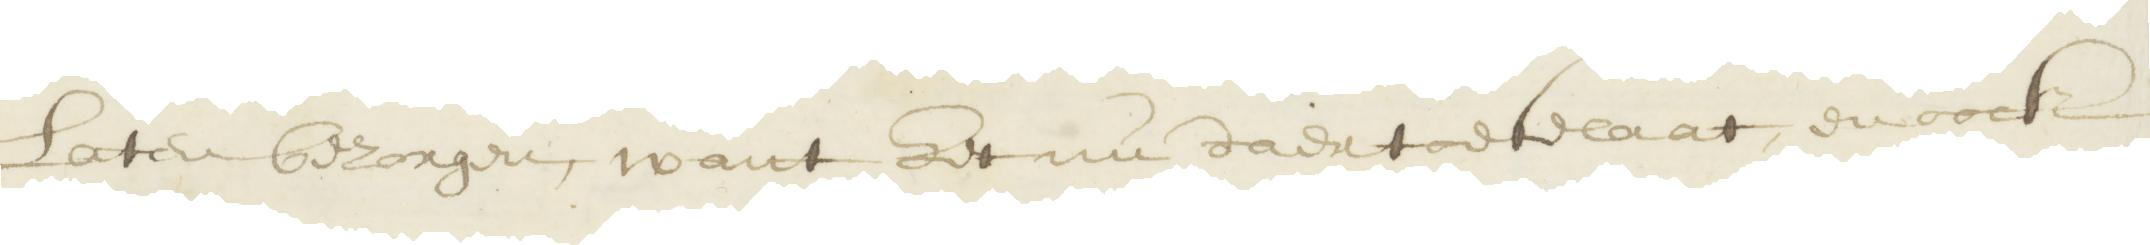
Laten bezorgen, want het nu daertoe te laat, en oock
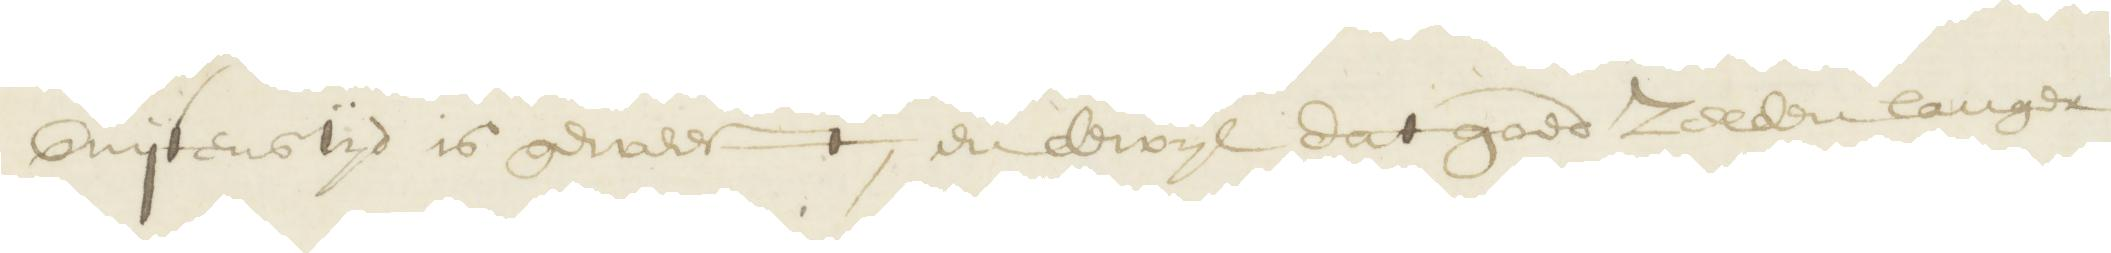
buijtens tijd is geweest, en dewijl dat goed zelden langer
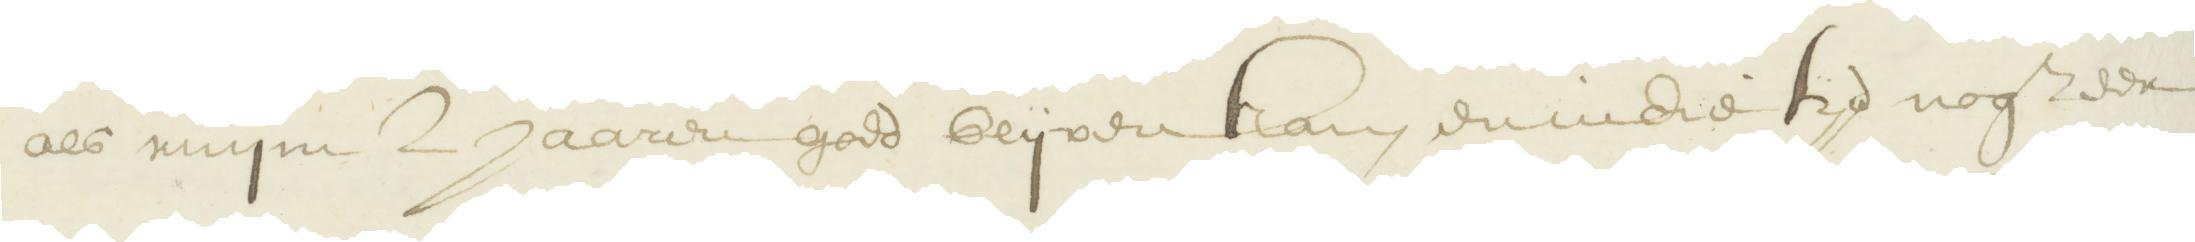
als ruijmt 2 jaaren goed blijven kan, en in die tijd nog zeer
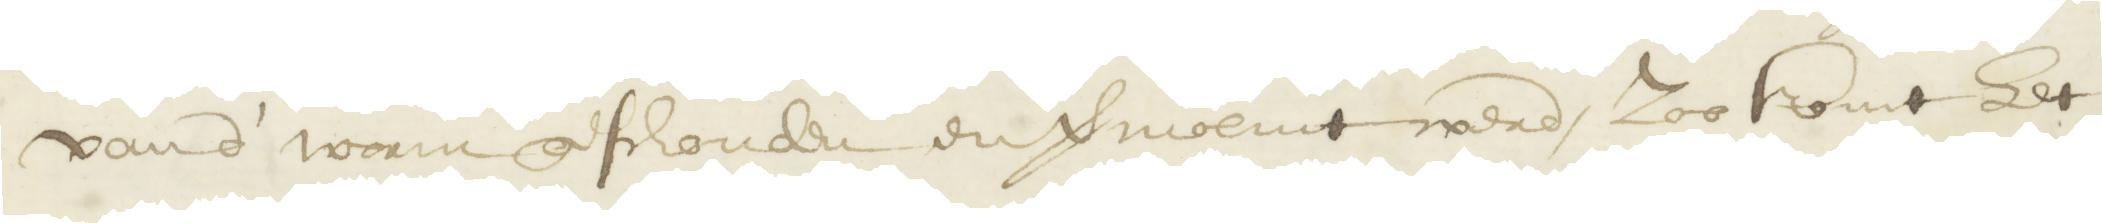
van d’ worm geschonden en vermolmt werd, zoo komt het
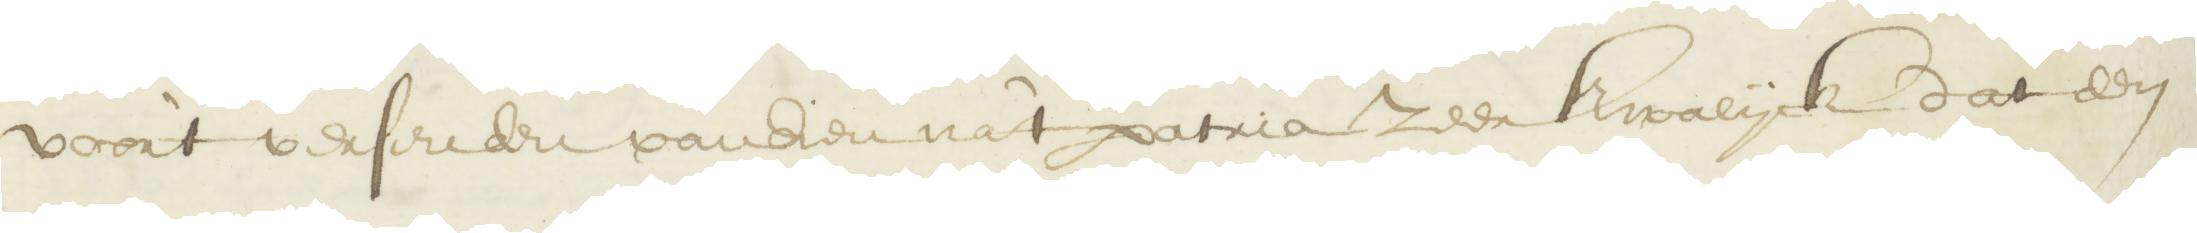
voor ’t versenden van dien na ’t patria zeer kwalijck dat den
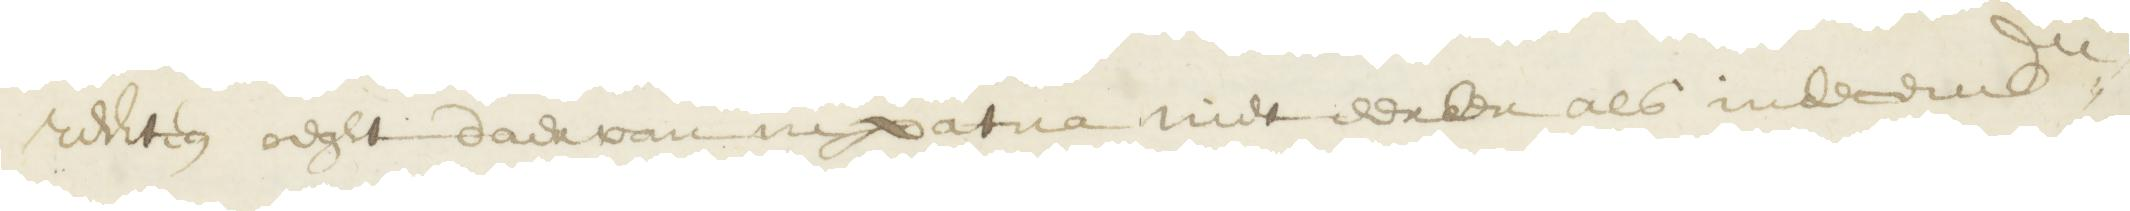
rechten oegst daer van in patria niet eerder als in decemb„r
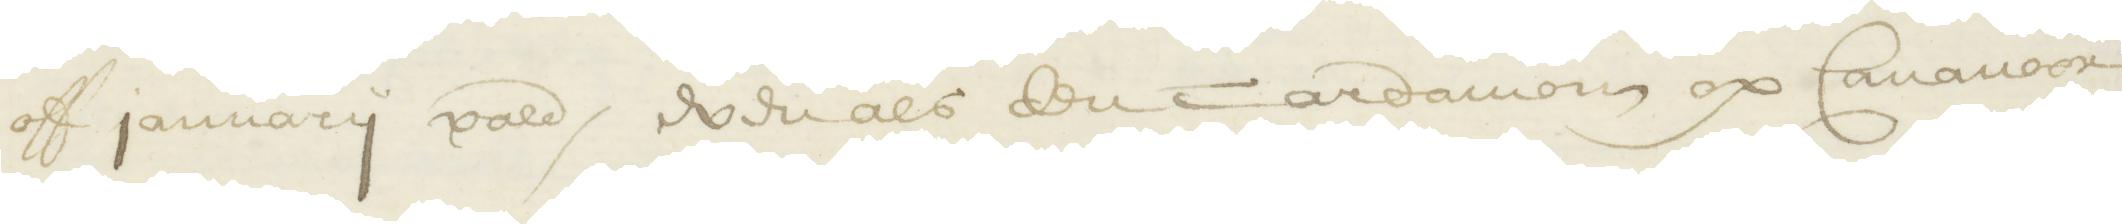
off januarij vald, even als den Cardamon op Cananoor
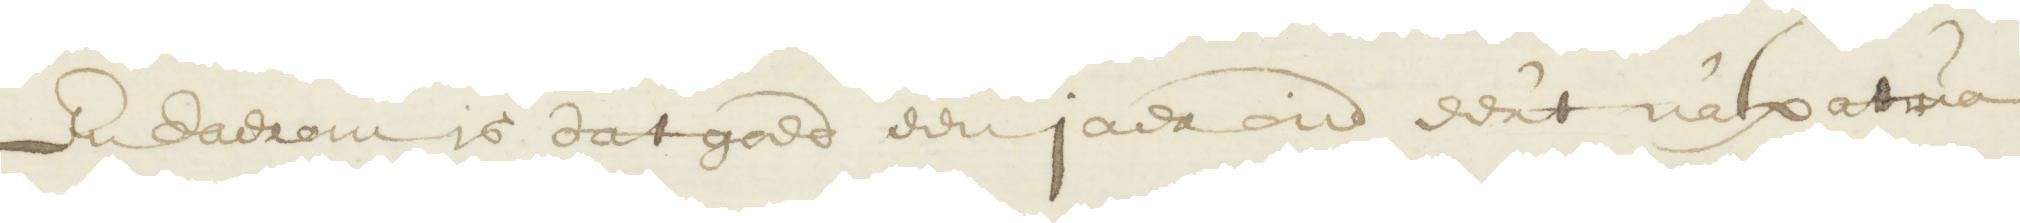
En daerom is dat goed een jaer oud eer 't na t patria
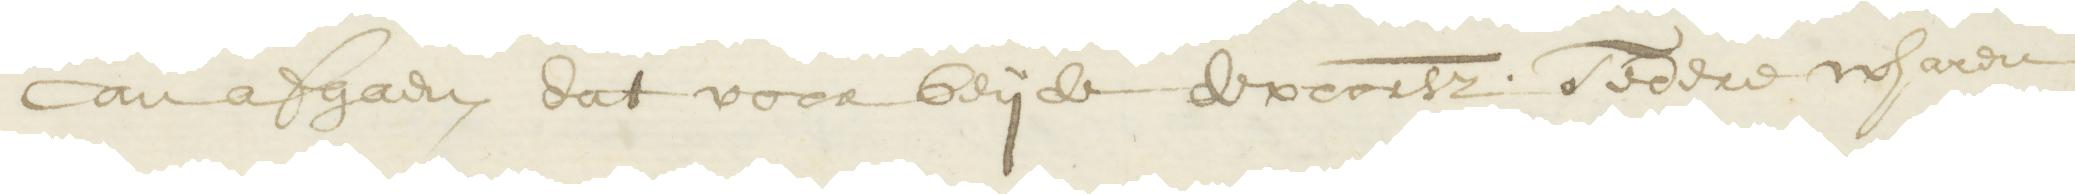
can afgaen, dat voor beijde de voorsz: Tedere wharen
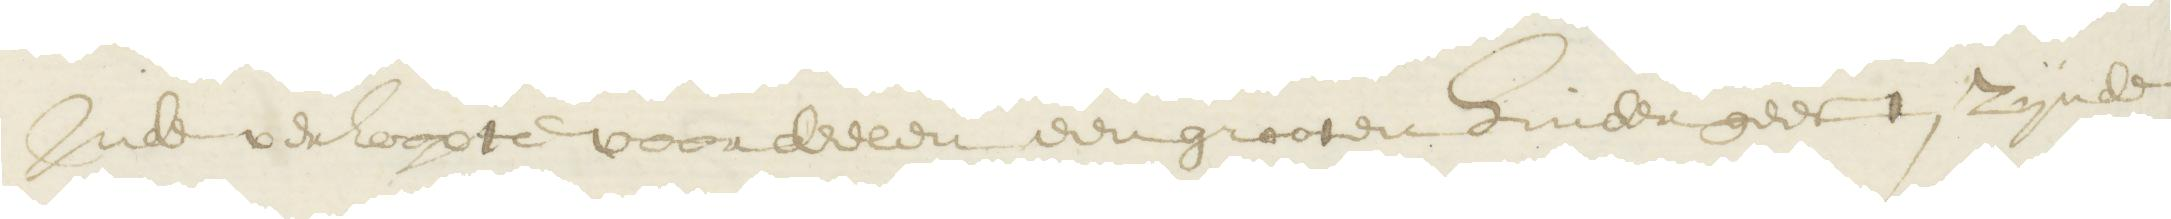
jnde verhoopte voor deelen een grooten hinder geeft, zijnde
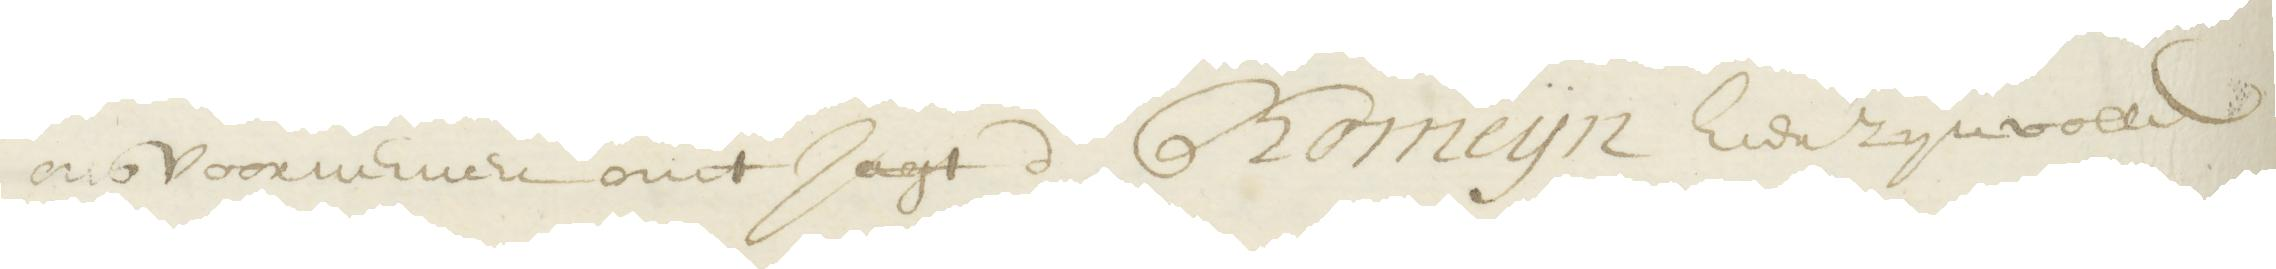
ons voornemen nu 't Jagt d' Romeijn hier zijn volle
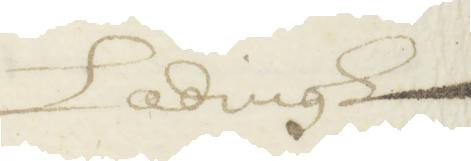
ladingh
